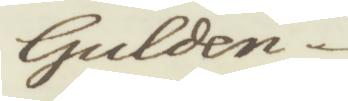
Gulden -
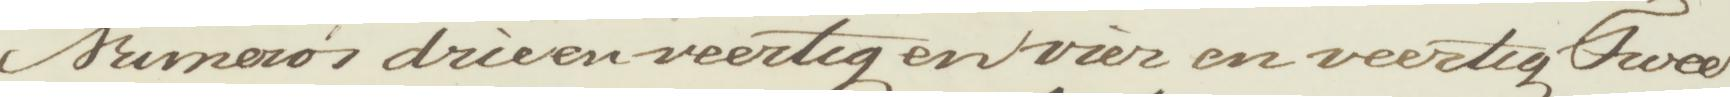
Numero's drie en veertig en vier en veertig Twee
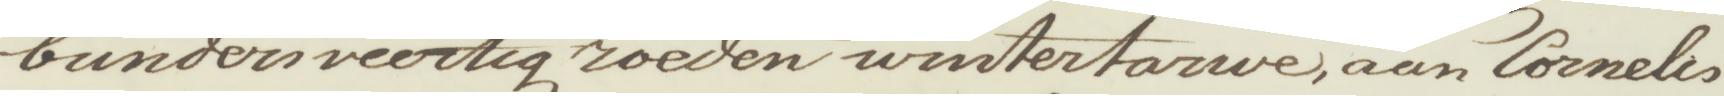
bunders veertig roeden wintertarwe, aan Cornelis
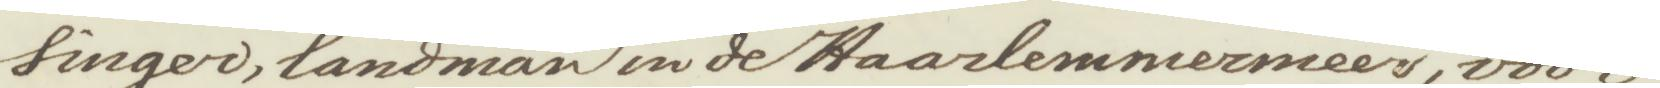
singer, landman in de Haarlemmermeer, voor
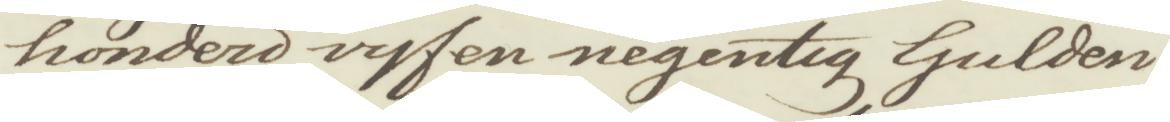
honderd vyf en negentig Gulden
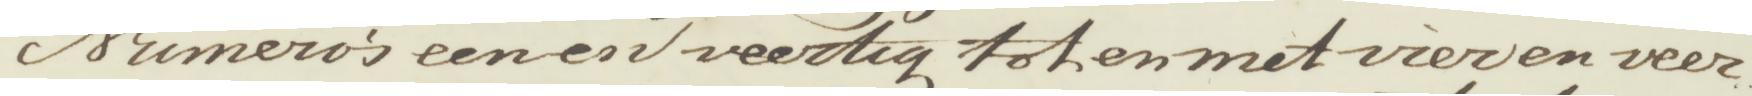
Numero's een en veertig tot en met vier en veer
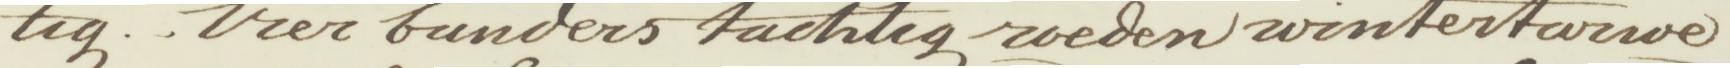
tig.. vier bunders tachtig roeden wintertarwe
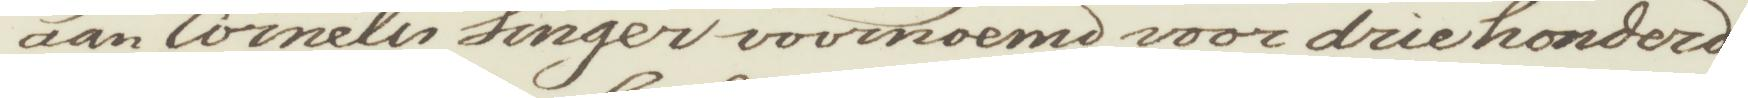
aan Cornelis Singer voornoemd voor drie honderd
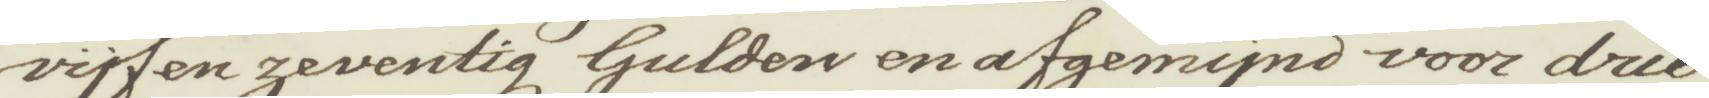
vijf en zeventig Gulden en afgemijnd voor drie
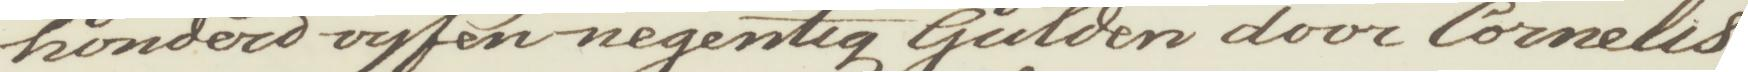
honderd vyf en negentig Gulden door Cornelis
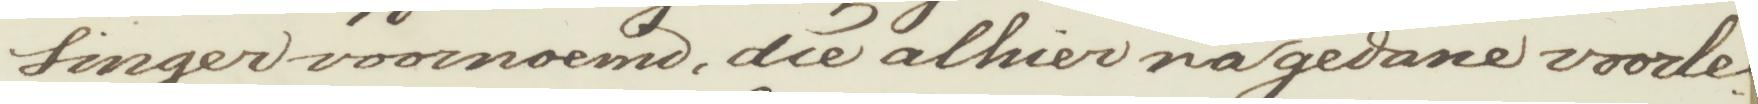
Singer voornoemd, die alhier na gedane voorle„
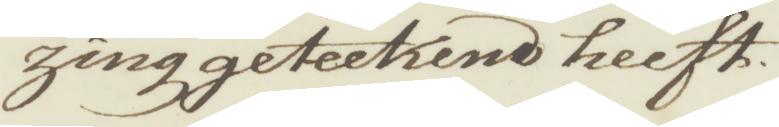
zing geteekend heeft.
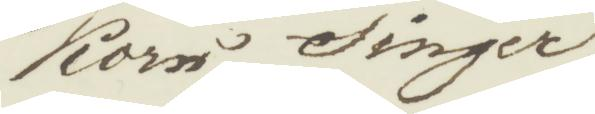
Korns Singer
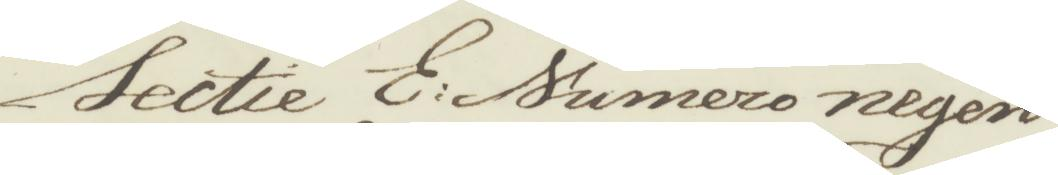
Sectie E: Numero negen
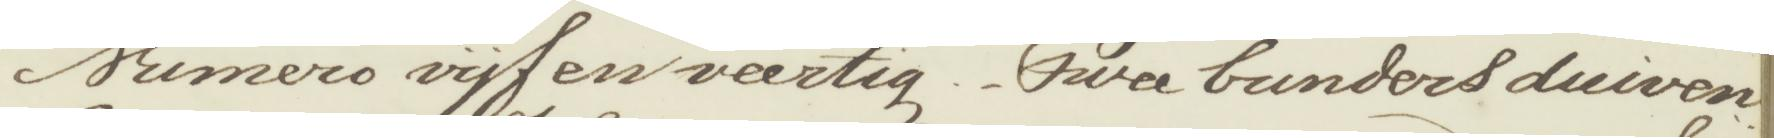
Numero vijf en veertig. - Twee bunders duiven
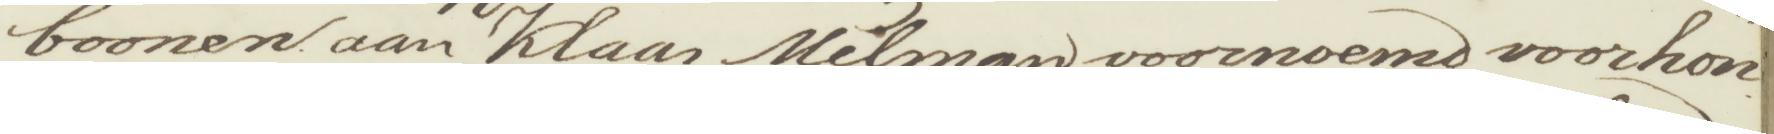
boonen aan Klaas Melman voornoemd voor hon.
